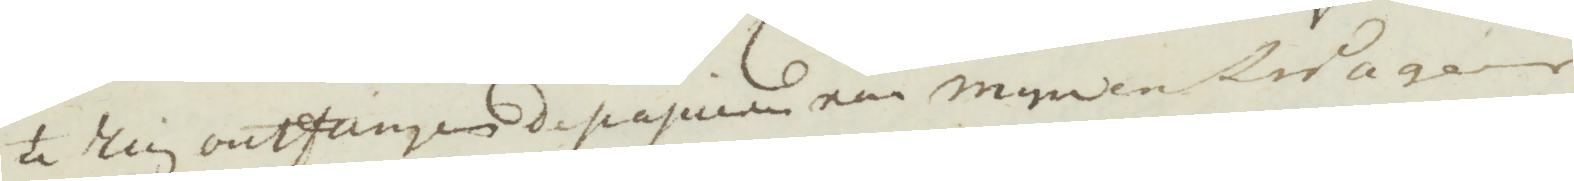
terug ontfangen de papieren van mynen Zwager
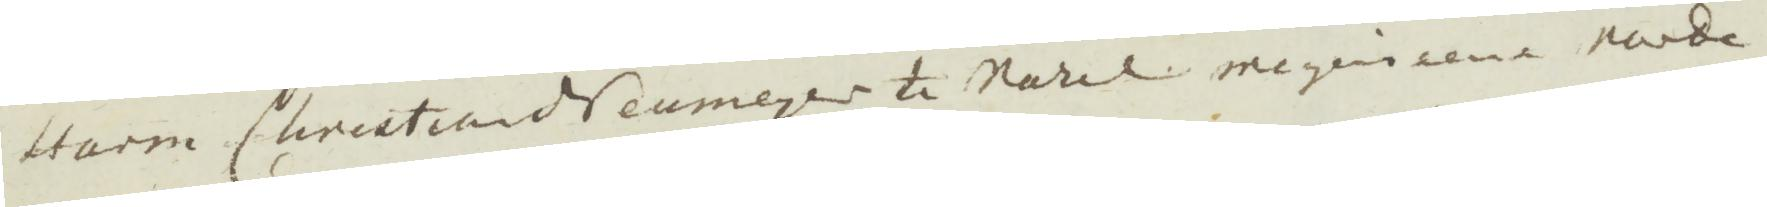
Harm Christian Neumeyer te Narel wegens eene vorde
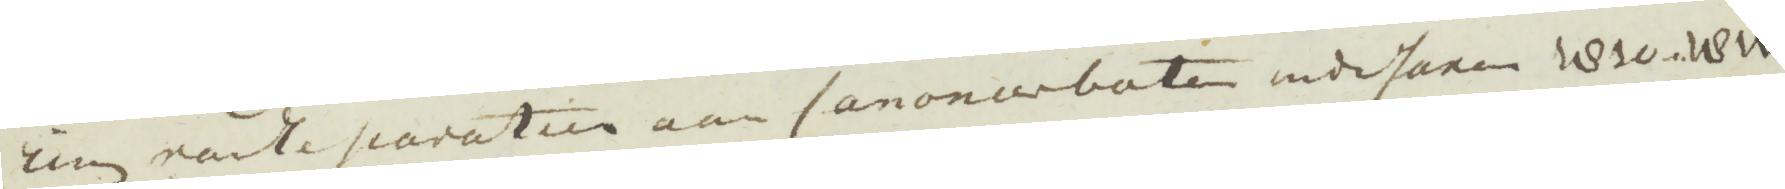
ring van reparatien aan Canoneerboten in de Jaren 1810, 1811
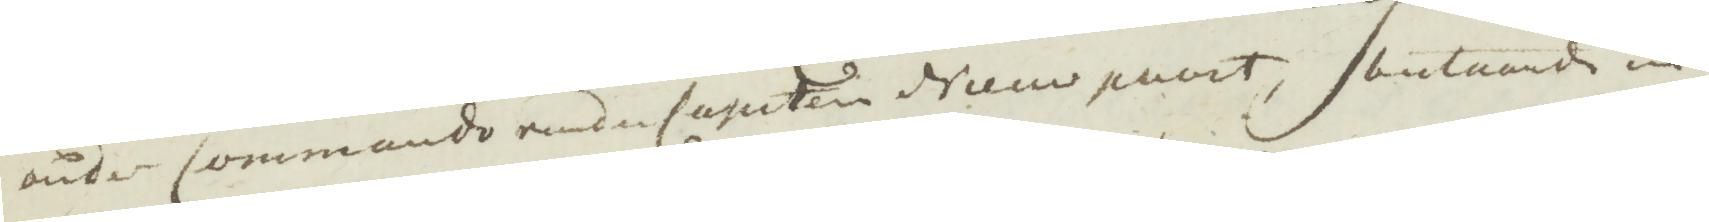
onder Commando van den Capitein Nieuwpoort, bestaand in
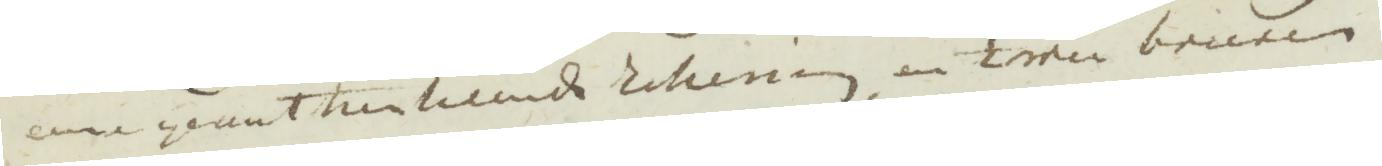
eene geauthenkeerde rekening, en twee brieven
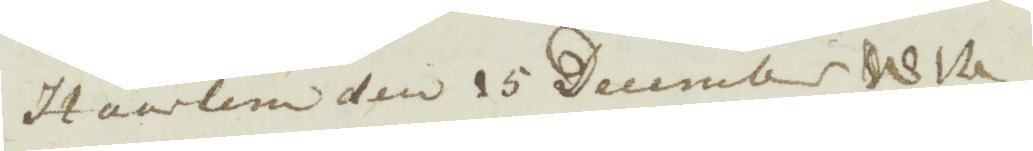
Haarlem den 15 December 1814
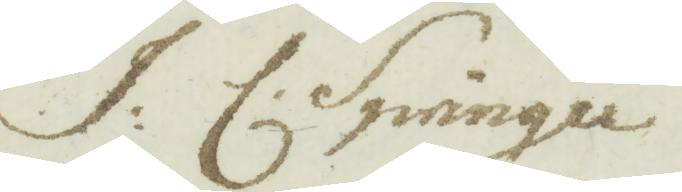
J: C: Springer
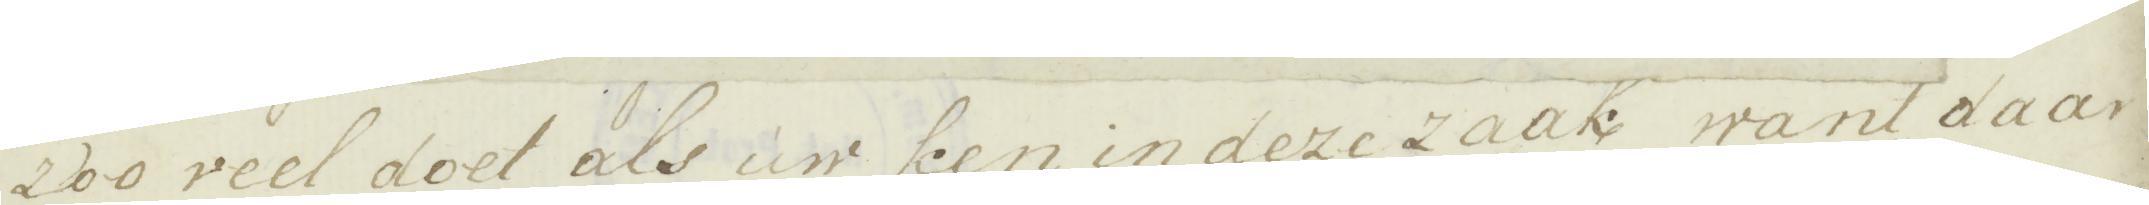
zoo veel doet als uw ken in deze zaak want daar
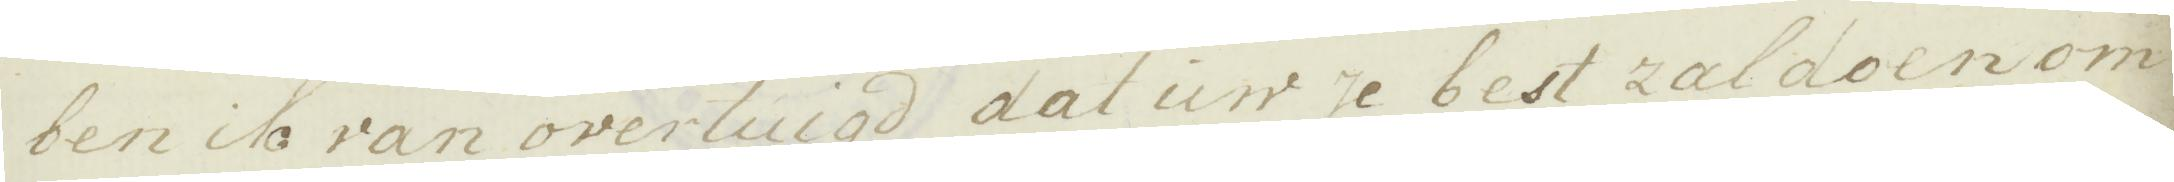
ben ik van overtuigd dat uw je best zal doen om
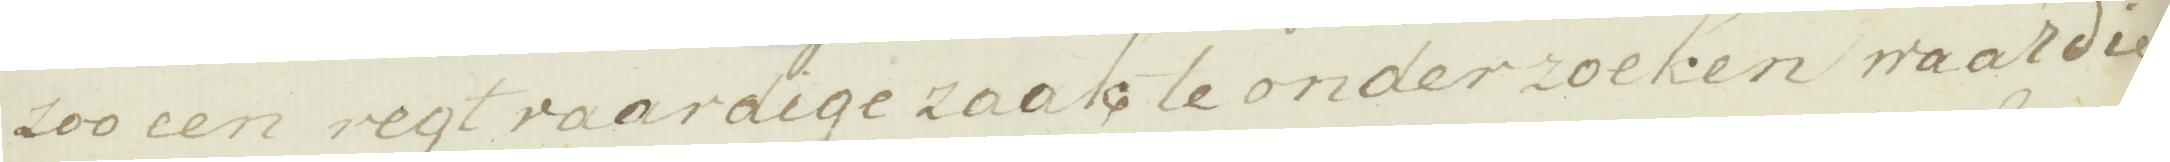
zoo een regtvaardige zaak te onderzoeken waar die
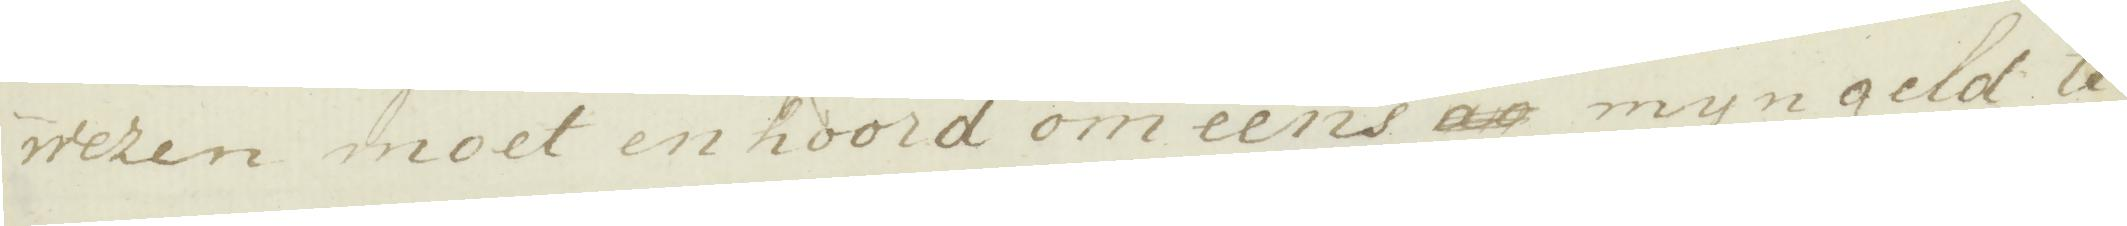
wezen moet en hoord om eens aa myn geld te
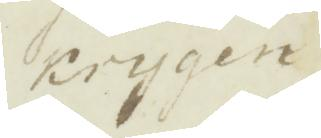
krygen
